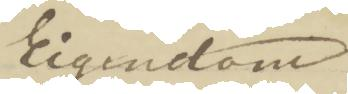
Eigendom
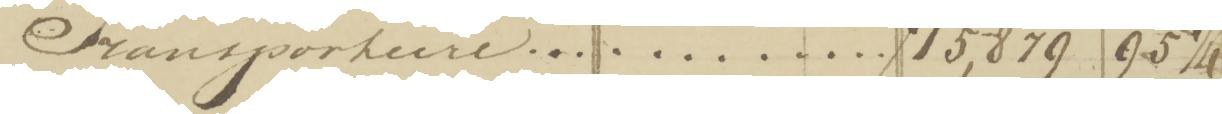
Transporteere. . . . . . . . . . . .ƒ 15,879 95¼
